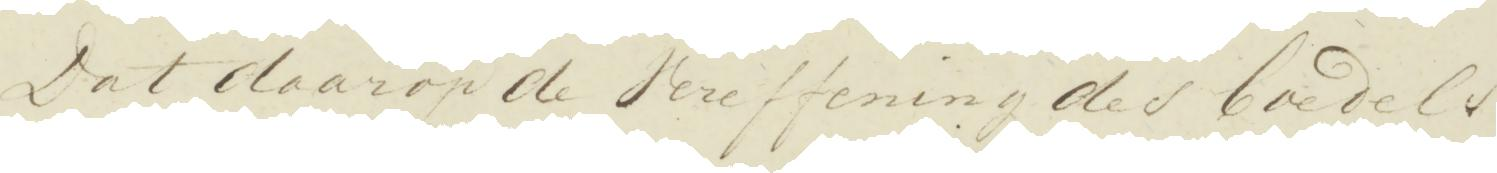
Dat daarop de Vereffening des boedels
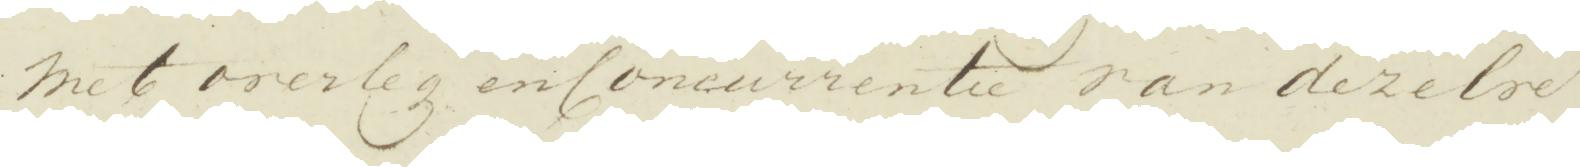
met overleg en concurrentie van dezelve
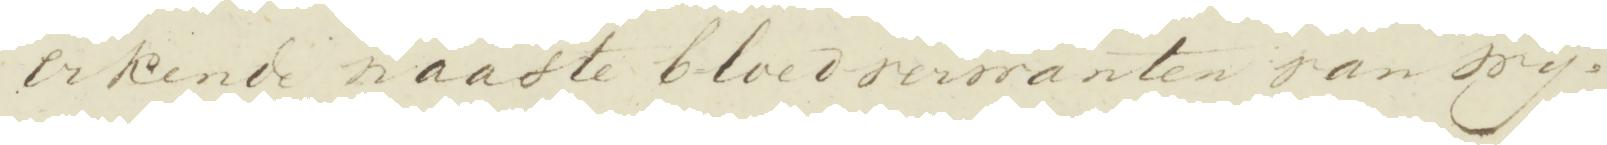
erkende naaste bloed verwanten van Wij„
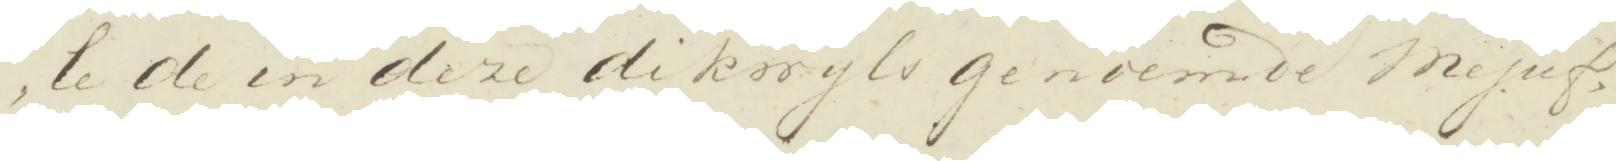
„le de in deze dikwijls genoemde Mejuf„
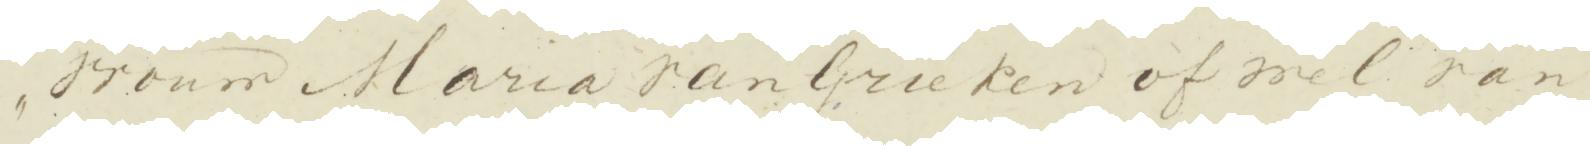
„Vrouw Maria van Grieken of wel van
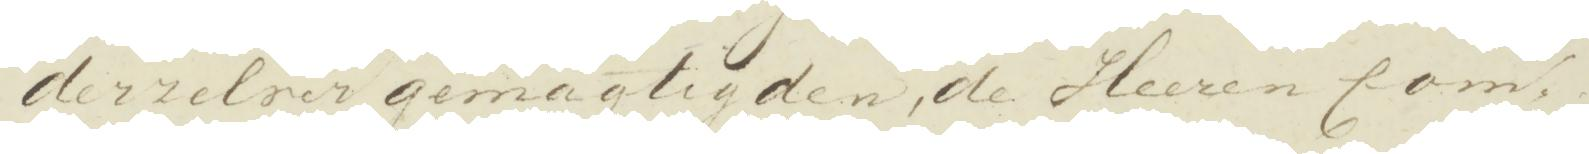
derzelver gemagtigden, de Heeren Com„
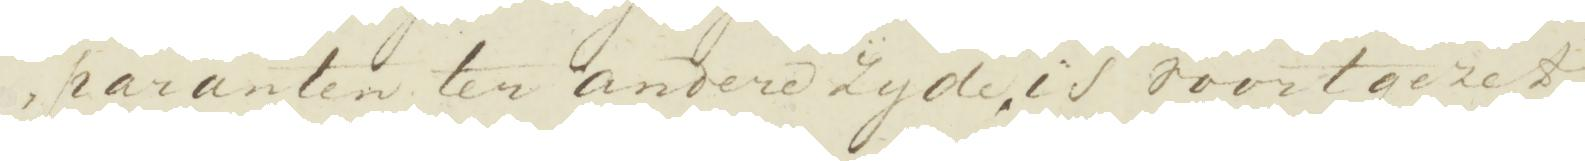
„paranten ter andere zijde, is voortgezet
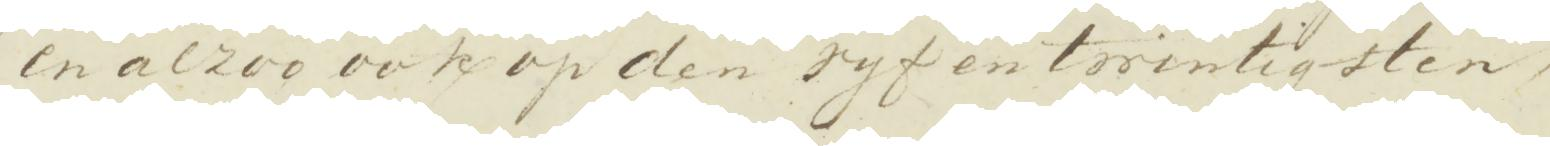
en alzoo ook op den vijf en twintigsten
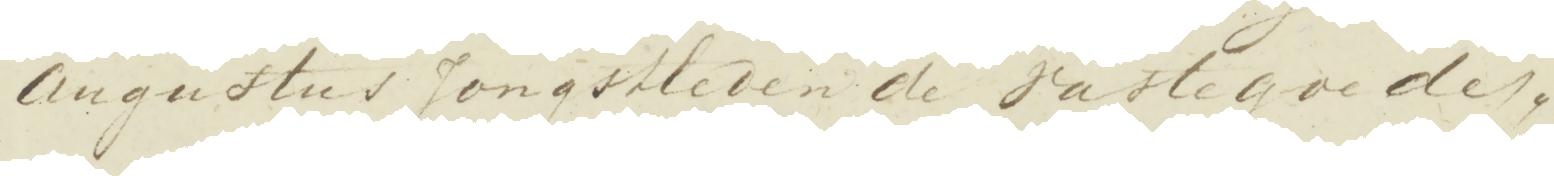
Augustus Jongstleden de Vaste goede„
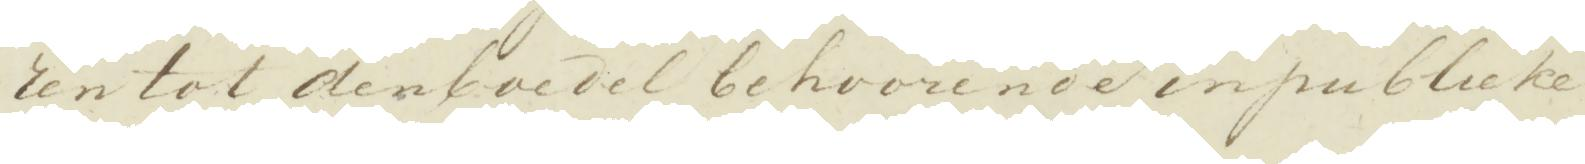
ren tot den boedel behoorende in publieke
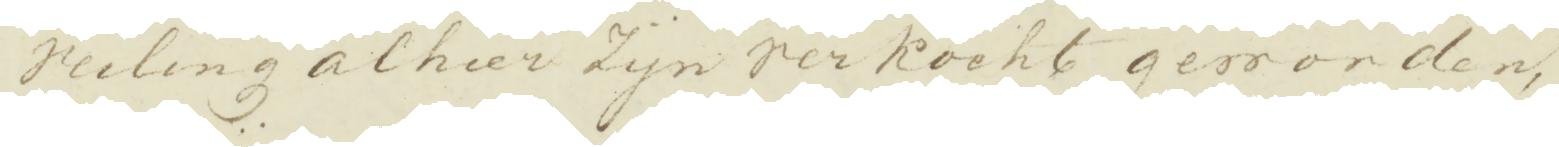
Veiling alhier zijn verkocht geworden,
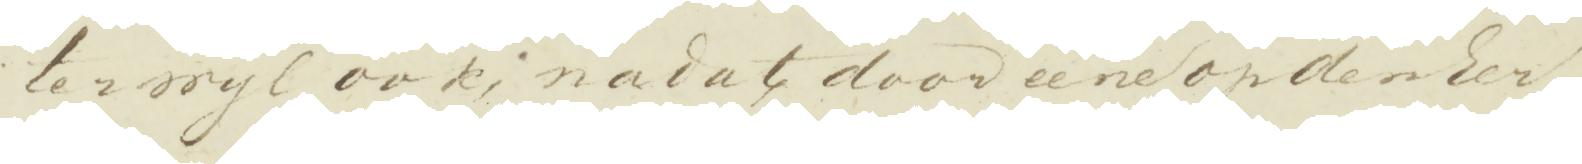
terwijl ook, nadat door eene op den Eer
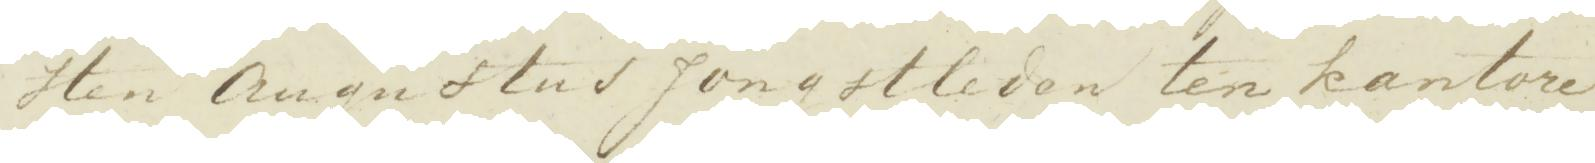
sten Augustus Jongstleden ten kantore
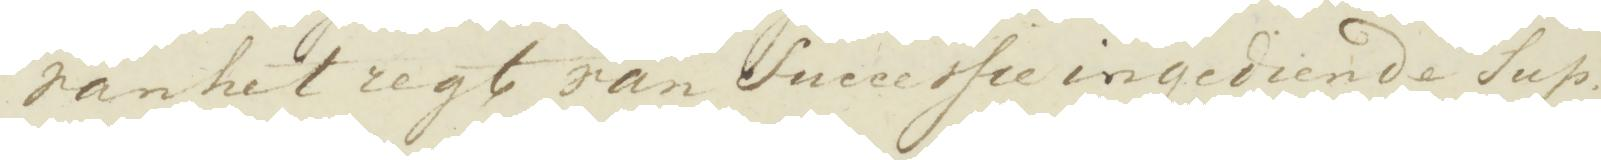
van het regt van successie ingediende sup
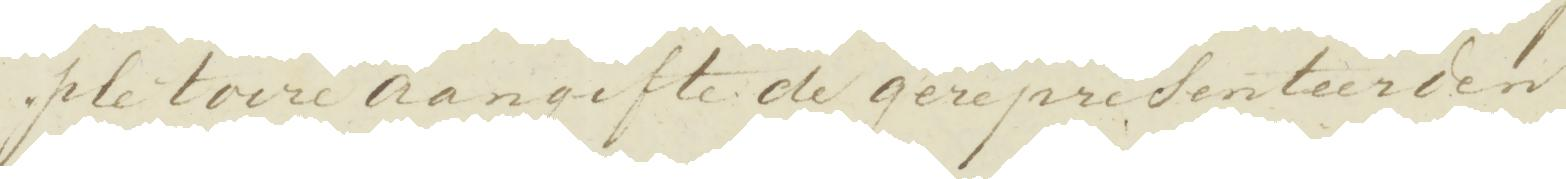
„pletoire aangifte de gerepresenteerden
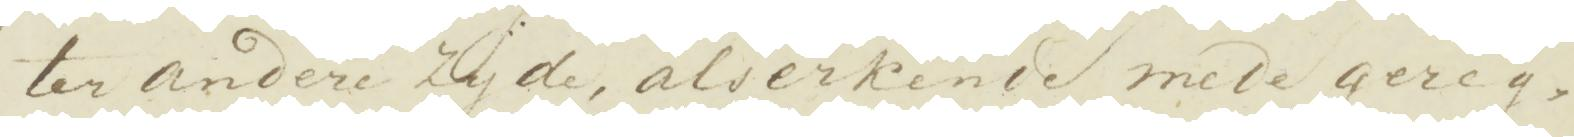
ter andere zijde, als erkende mede gereg„
